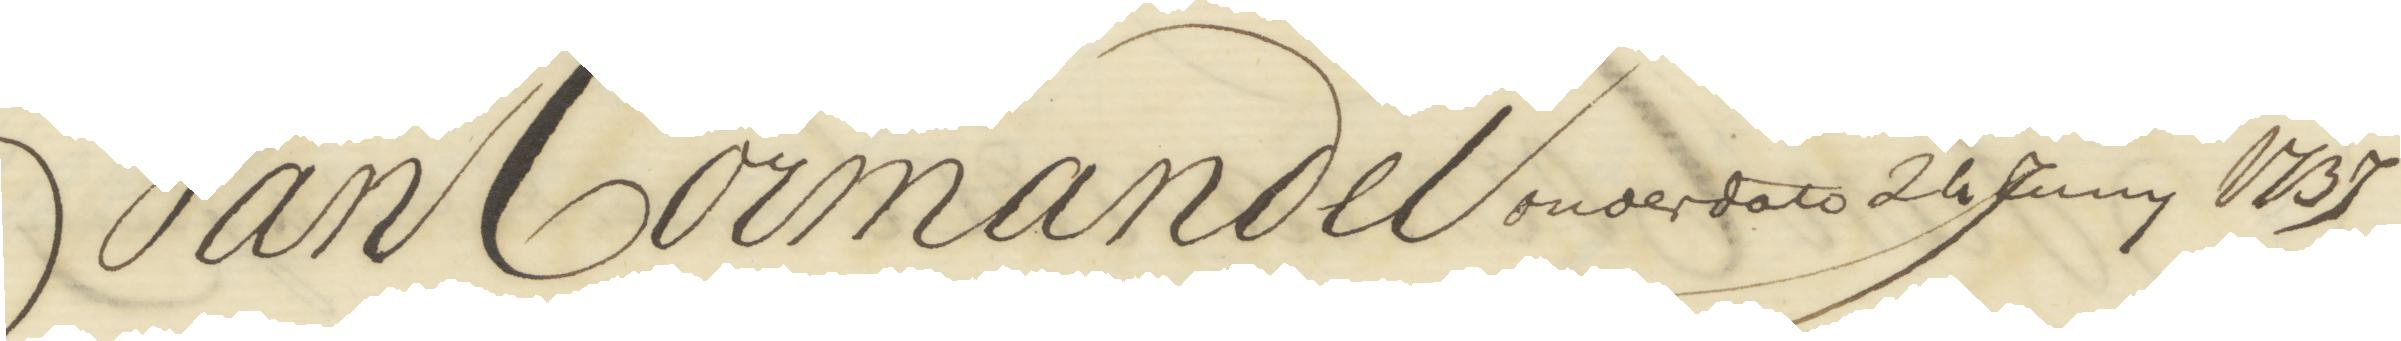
Van Cormandel onderdato 24 Juny 1737
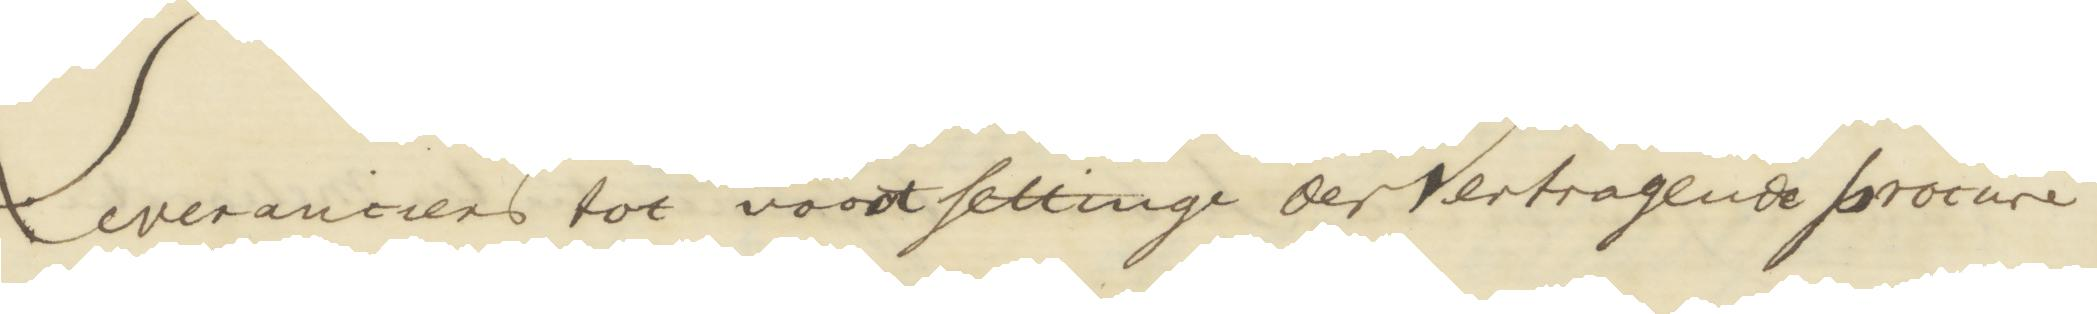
Leveranciers tot voortsettinge der Vertragende procure
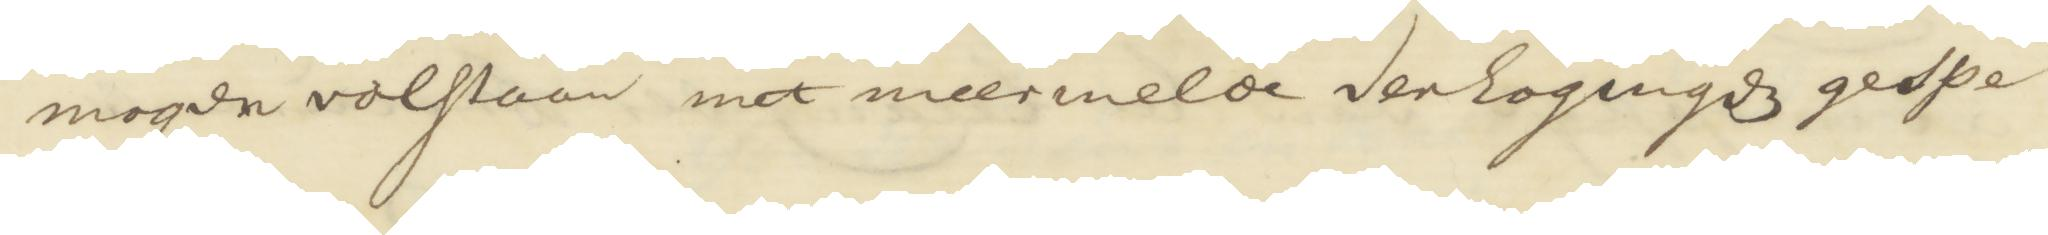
mogen volstaan met meermelde verhogingen gespe
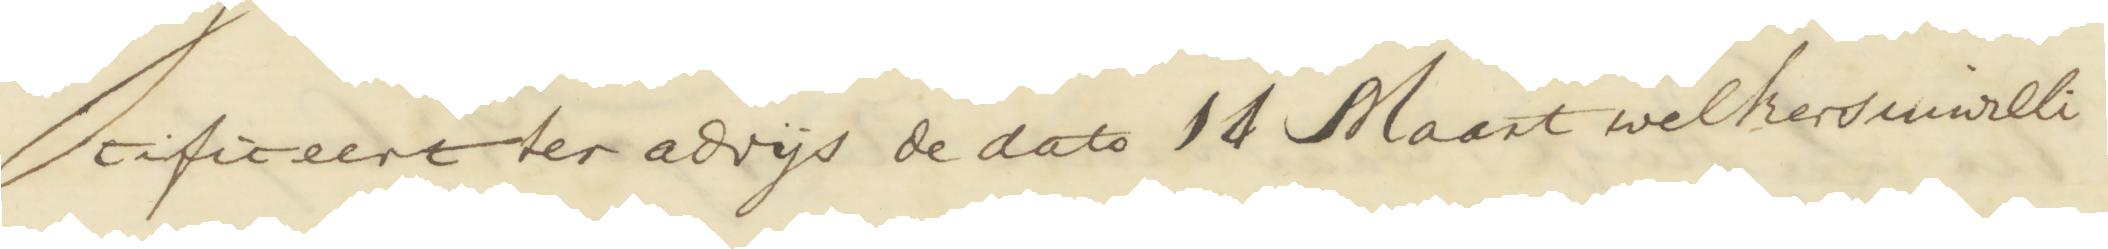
cificeert ter advijs de dato 14 Maart welkers inwilli
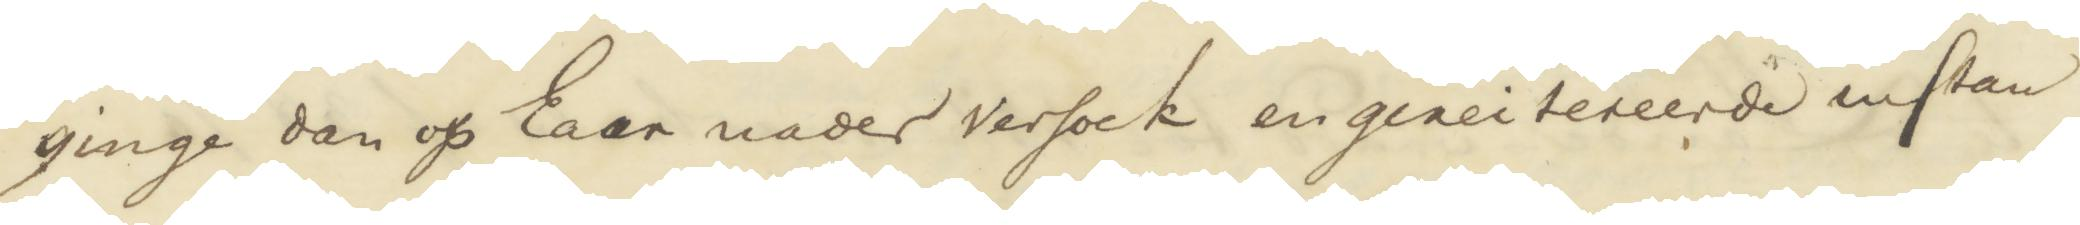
ginge dan op haar nader versoek en gereitereerde instan
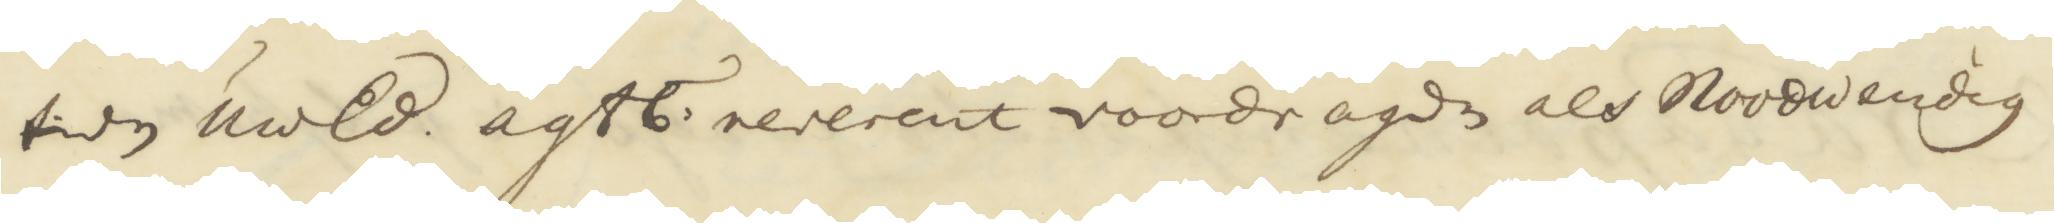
tien uwEd: agtb: reverent voordragen als Noodwendig
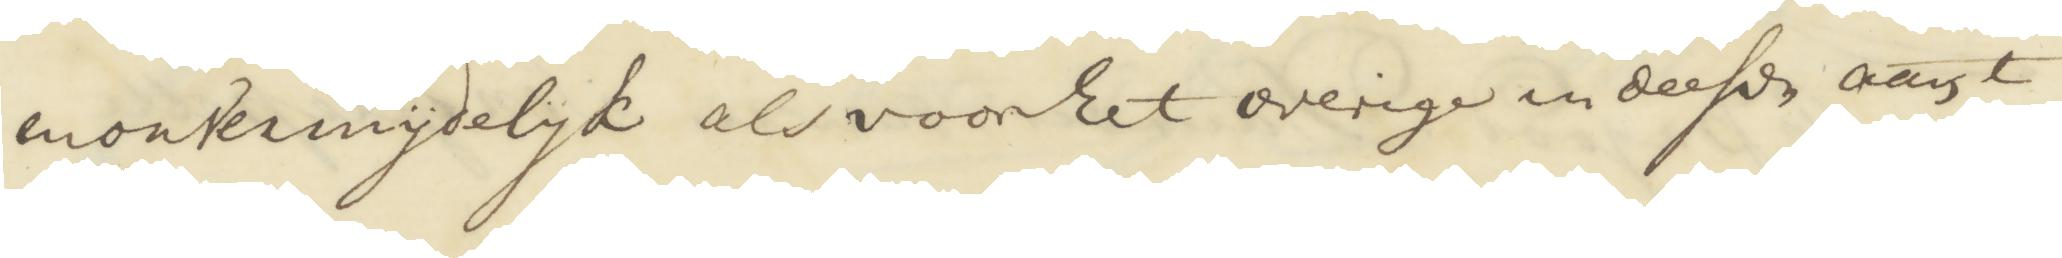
en onvermijdelijk als voor het overige in deesen aan t
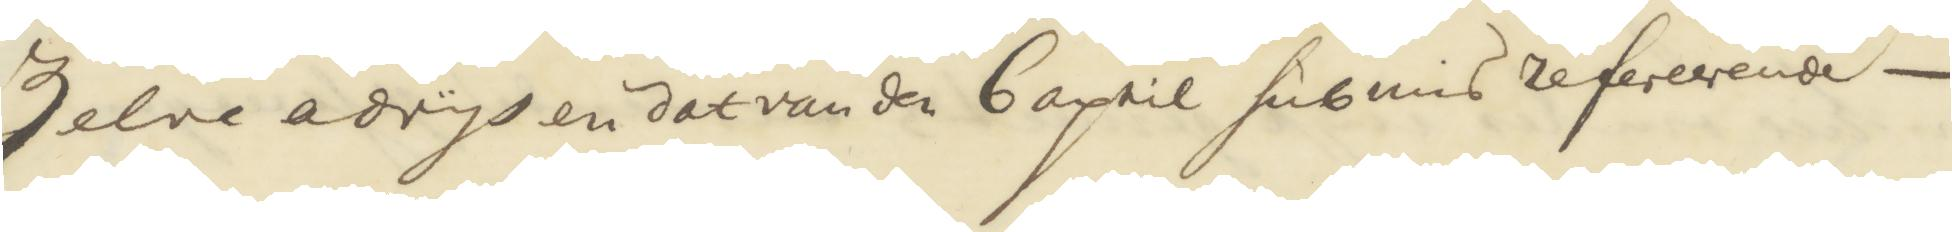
zelve advijs en dat van den baptil submis refereerende —
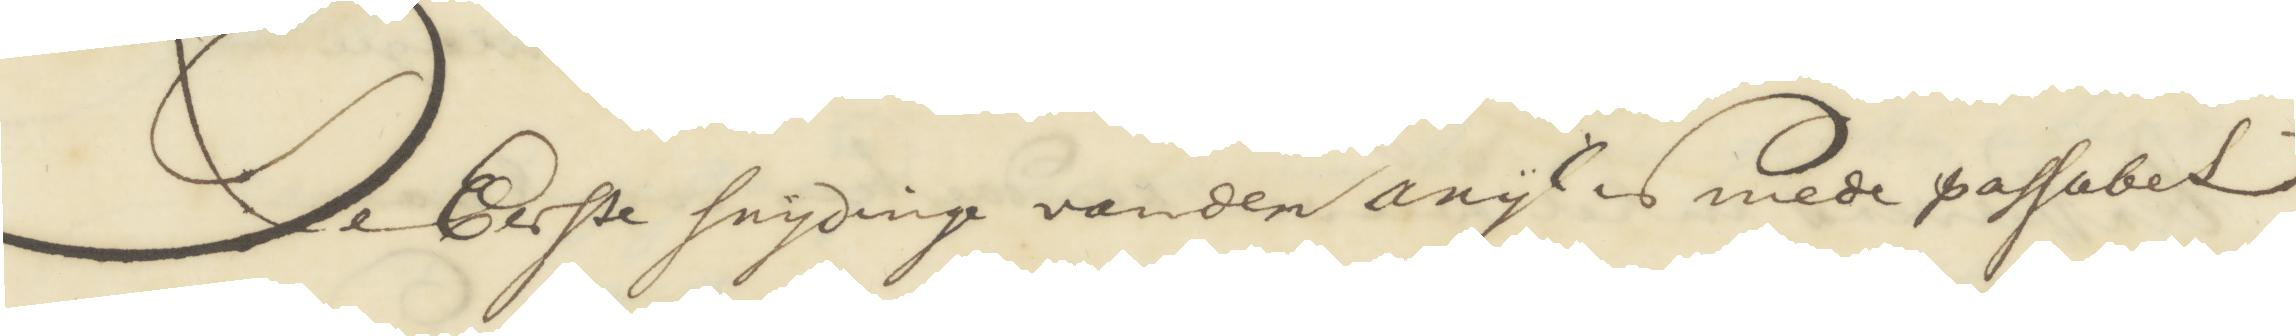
De Eerste snijdinge van den arijl is mede passabel
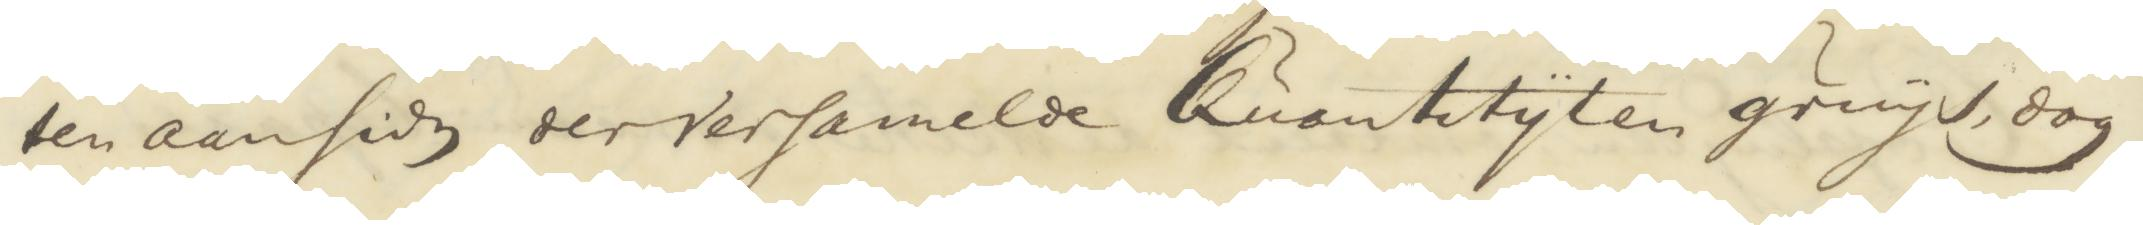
ten aansien der versamelde Quantitijten gruijs, dog
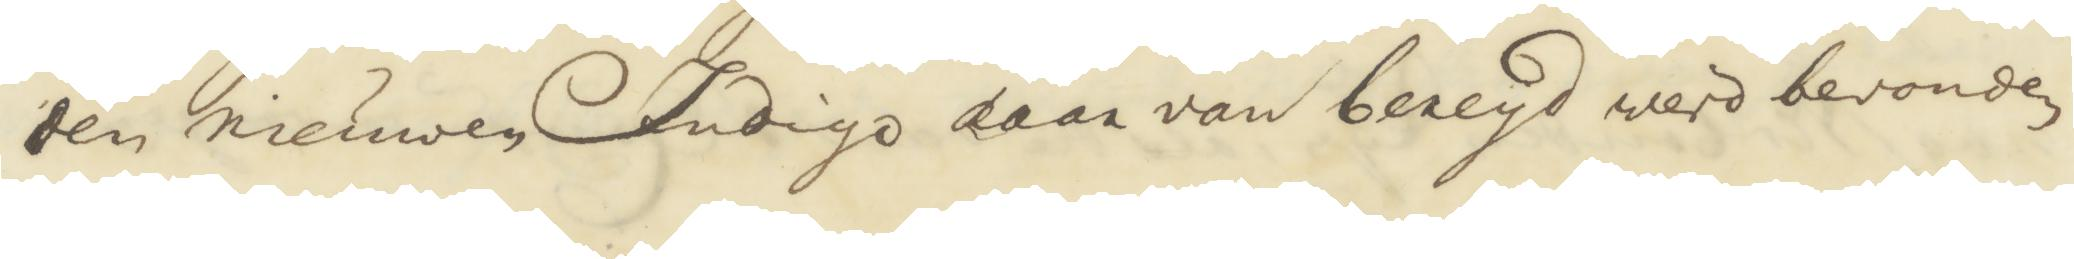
den nieuwen Indigo daar van bereijd werd bevonden
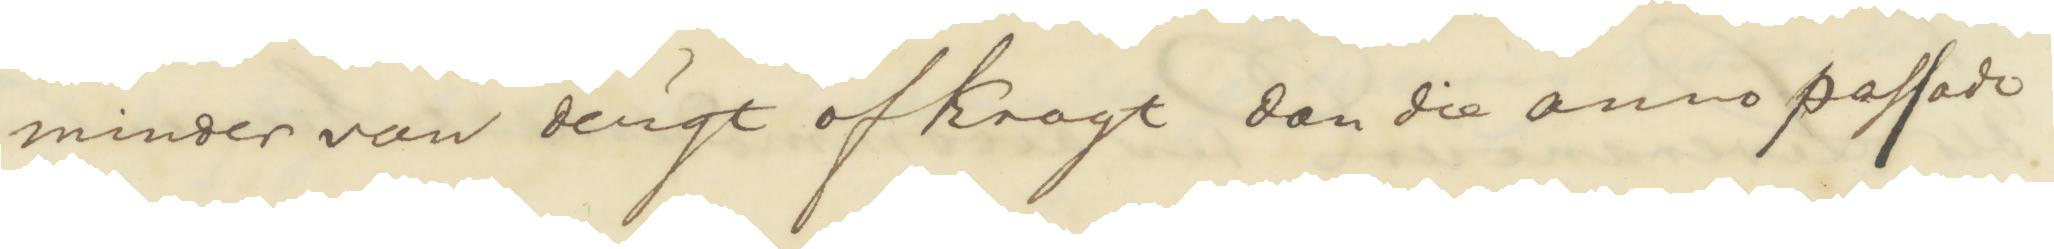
minder van deugt of kragt dan die anno passado
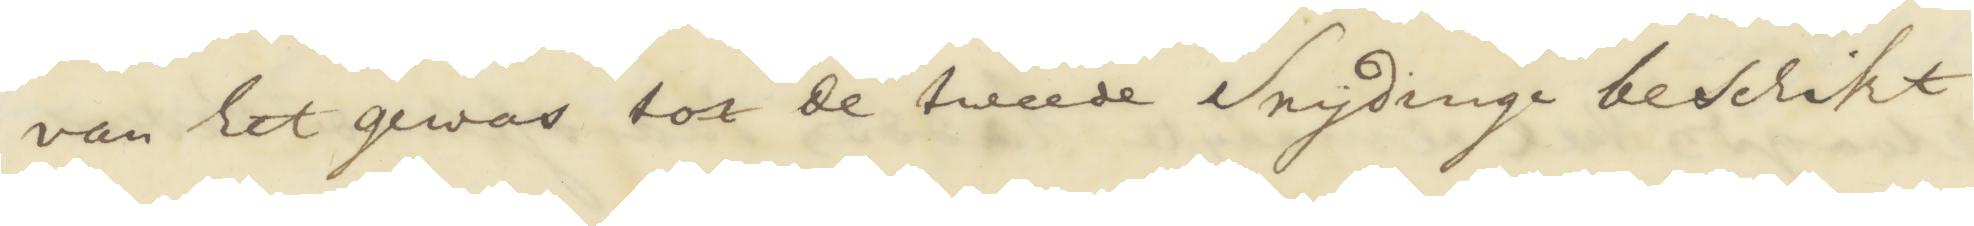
van het gewas tot de tweede snijdinge beschikt
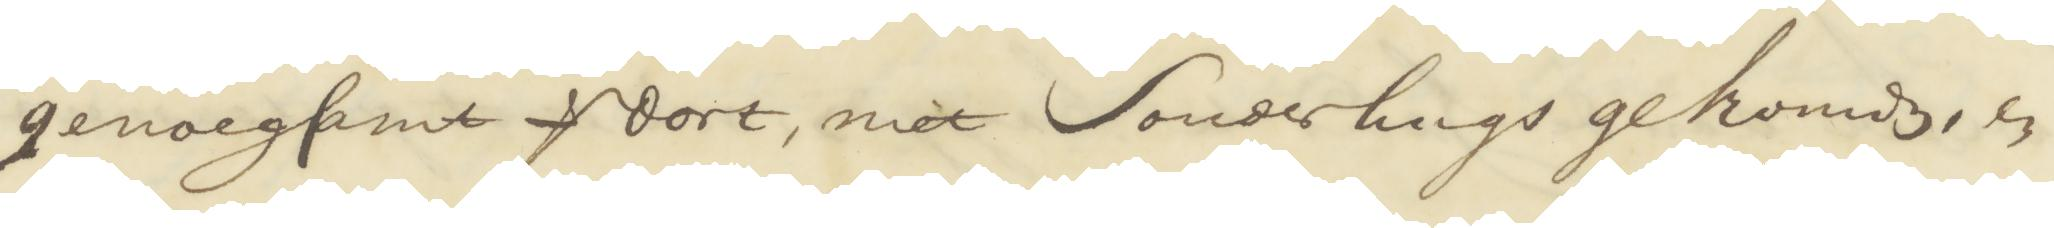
genoegsamt verdort, niet sonderlings gekomen, en
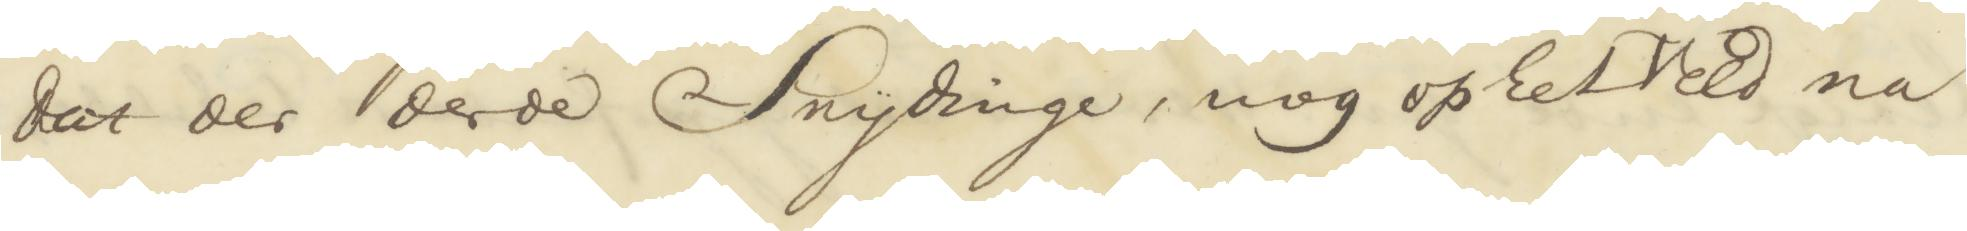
dat der derde snijdinge, nog op het veld na
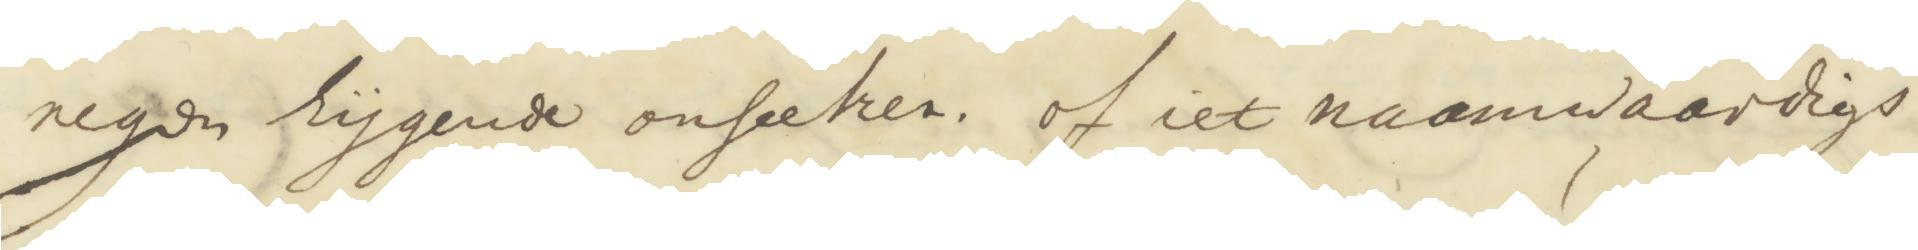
regen hijgende onseeker. of iet naamwaardigs
